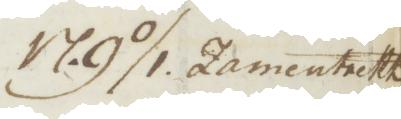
17.9 0/1. Zamentrekk
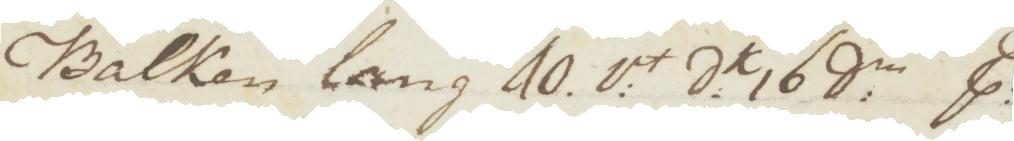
Balken lang 40. v:t d:k 16 d:m p:s
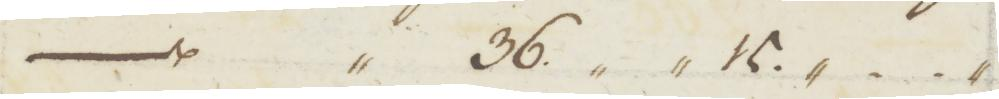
_o „ 36. „ „ 15. „ - - „
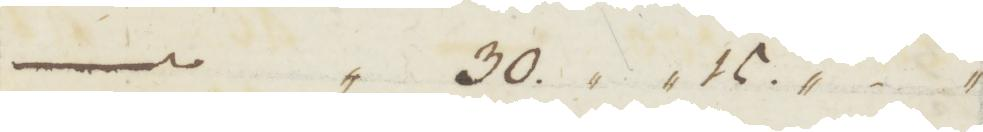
_o „ 30. „ „ 15. „ - „
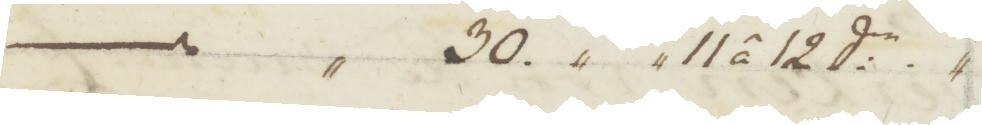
_o „ 30. „ „ 11 â 12 d:m - „
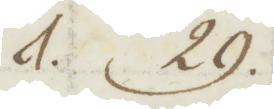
4. 29.
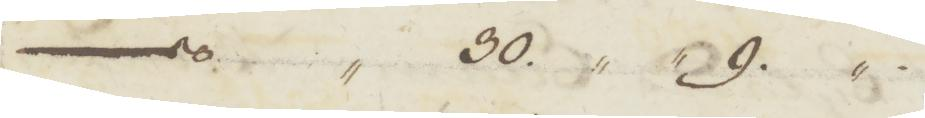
_o „ 30. „ „ 9. „ -
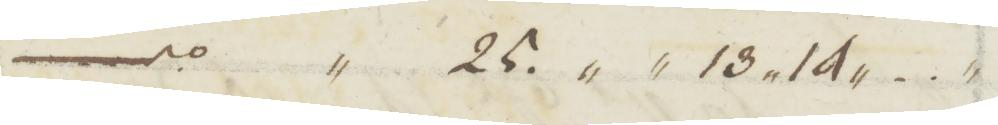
_o „ 25. „ „ 13„14„ - - „
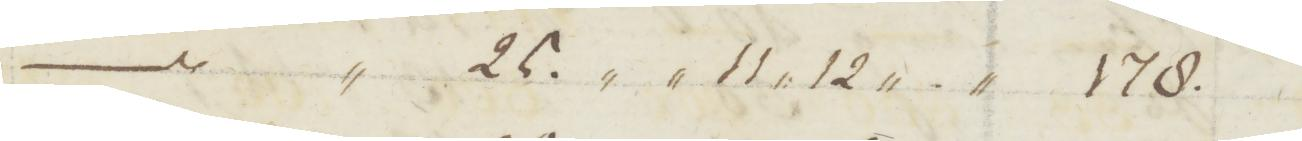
_o „ 25. „ „ 11„12„ - „ 178.
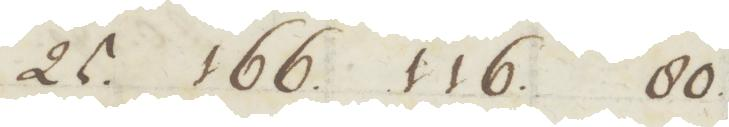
25. 166. 116. 80.
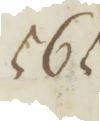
565
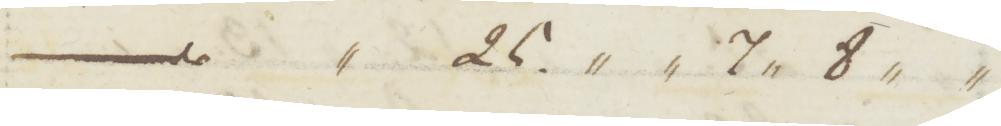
_o „ 25. „ „ 7„ 8 „ „
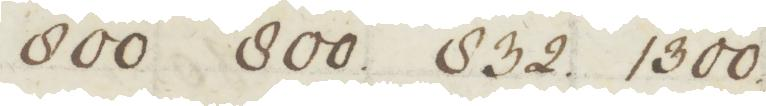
800 800. 832. 1300.
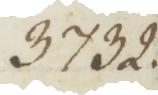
3732.
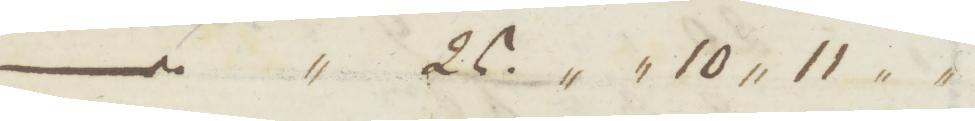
_o „ 25. „ „ 10„ 11 „ „
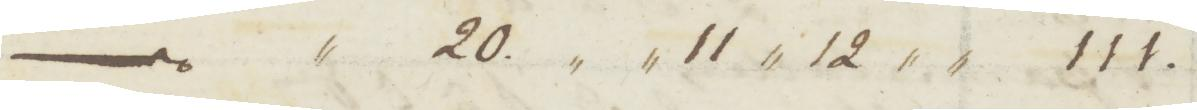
_o „ 20. „ „ 11 „ 12 „ „ 111.
